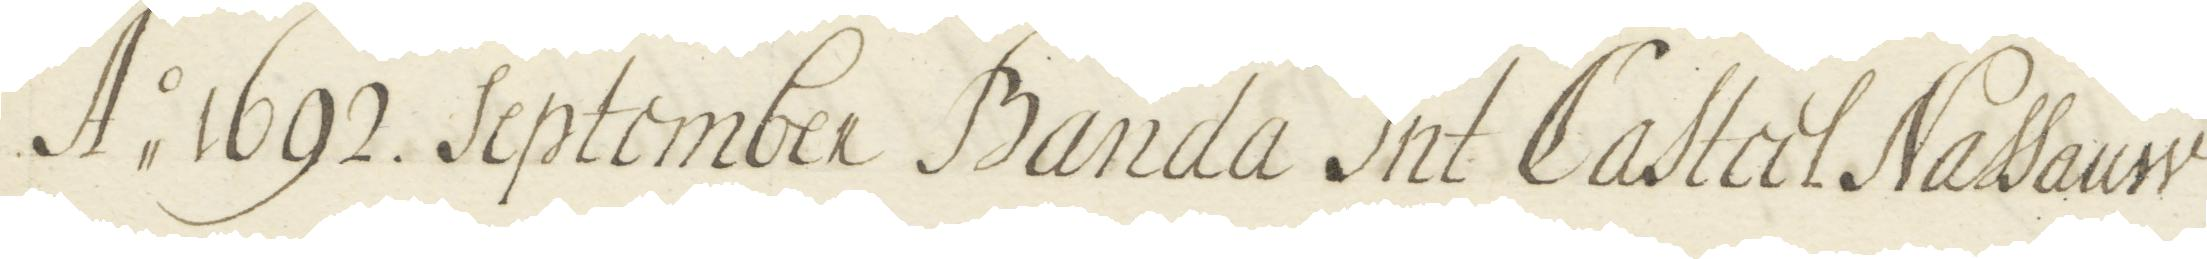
A„o 1692. September Banda Int Casteel Nassauw
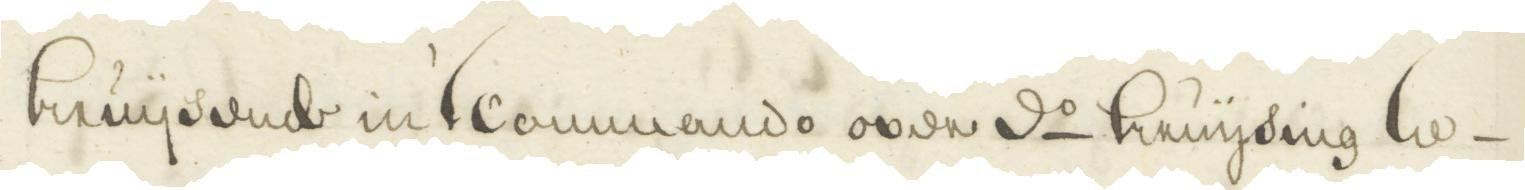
kruijsende in ’t Commando over d=o kruijsing te —
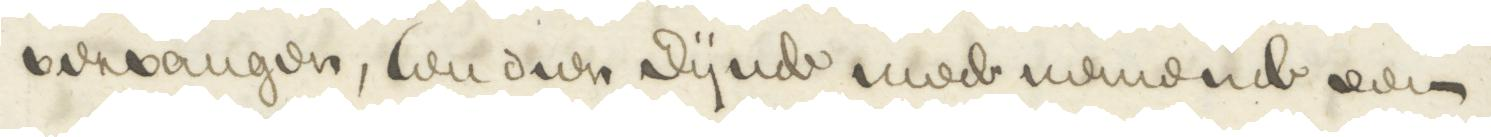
vervangen, ten dien Eijnde mede nemende een
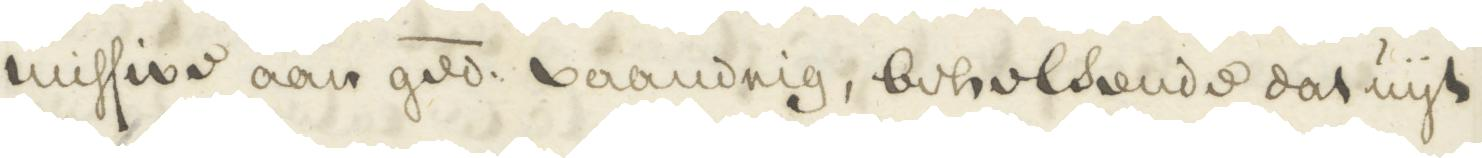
missive aan ged: vaandrig, behelsende dat uijt
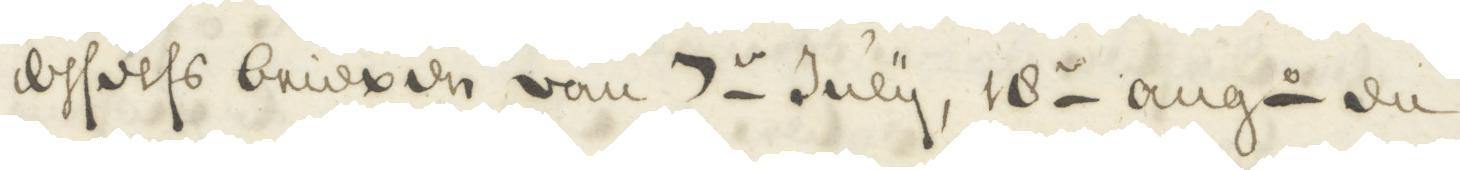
desselfs brieven van 7=e Iulij, 18=e aug=o en
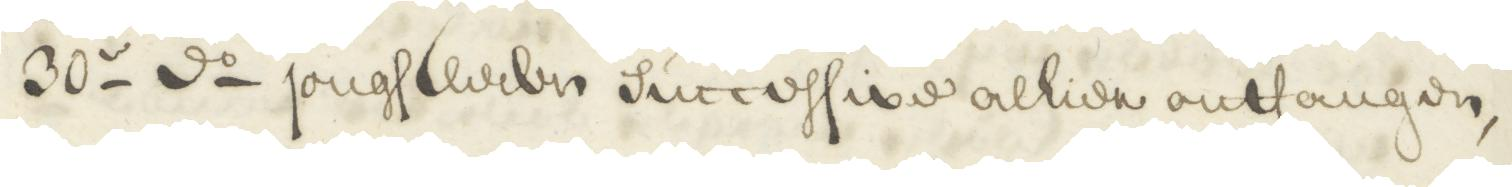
30=en d=o jongstleden successive alhier ontfangen,
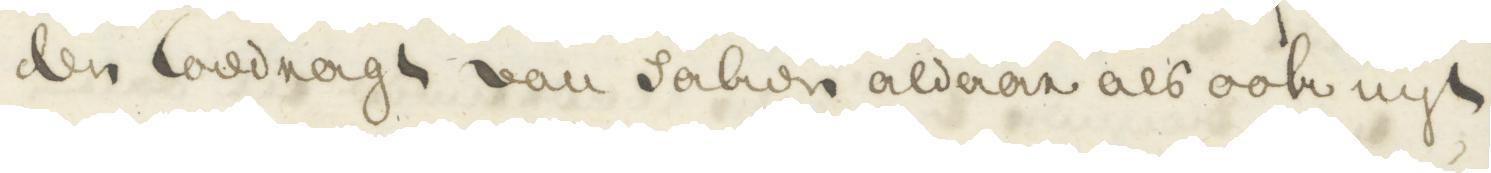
den toedragt van saken aldaar als ook uijt
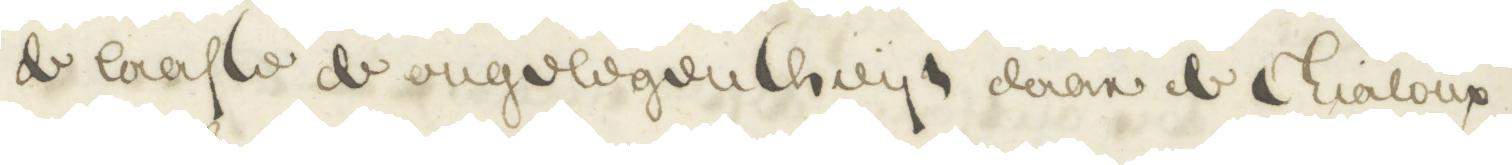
de laaste de ongelegentheijt daar de Chialoup
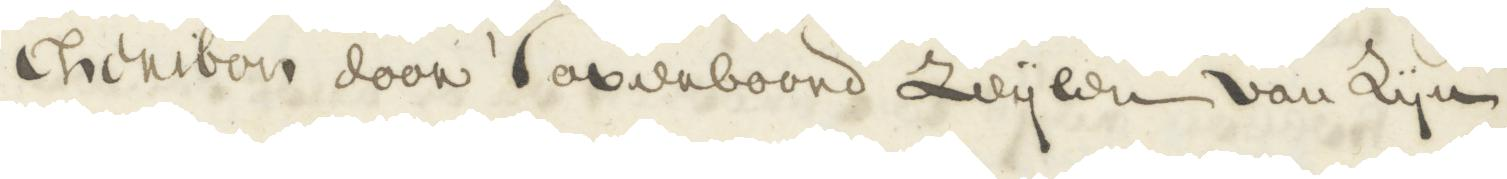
Cheribon door ’t overboord zeijlen van zijn
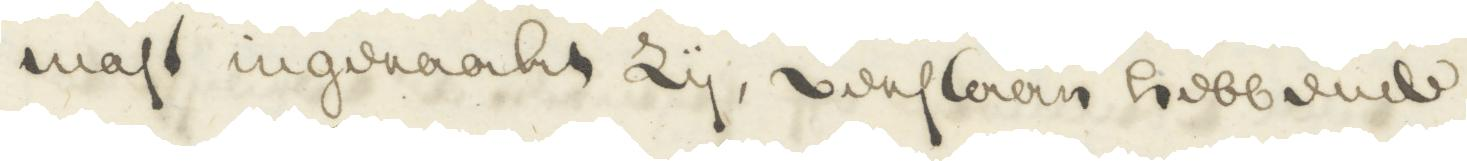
mast ingeraakt zij, verstaan hebbende
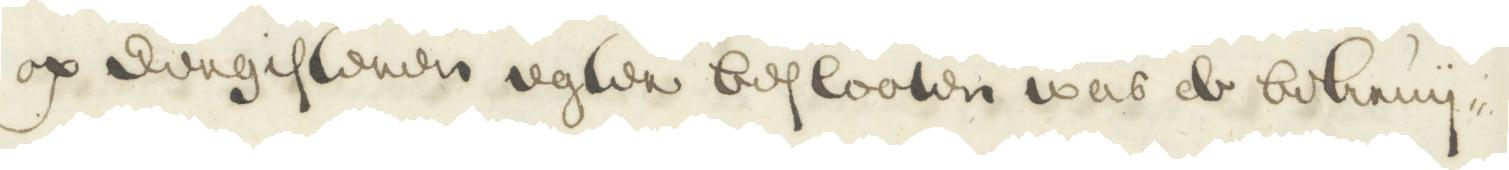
op eergisteren egter beslooten was de bekruij„
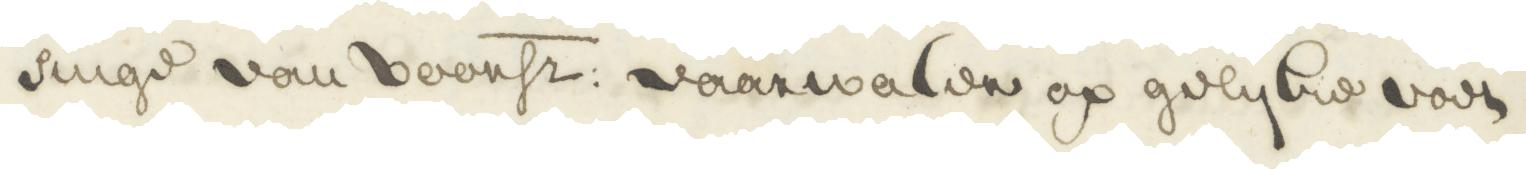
singe van voorsz: vaarwater op gelijke voet
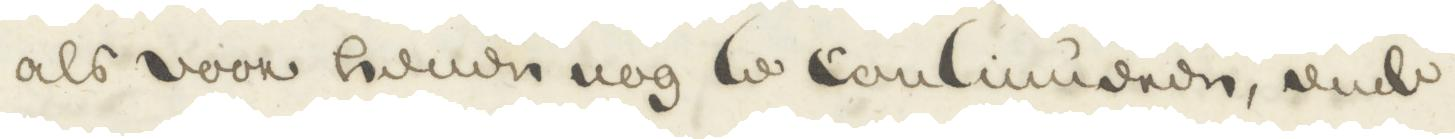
als voor henen nog te continueren, ende
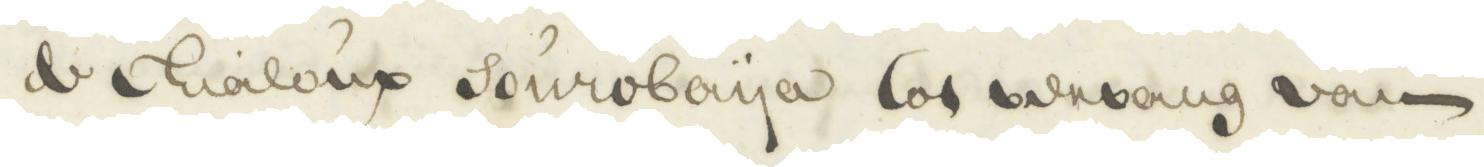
de Chialoup sourobaija tot vervang van
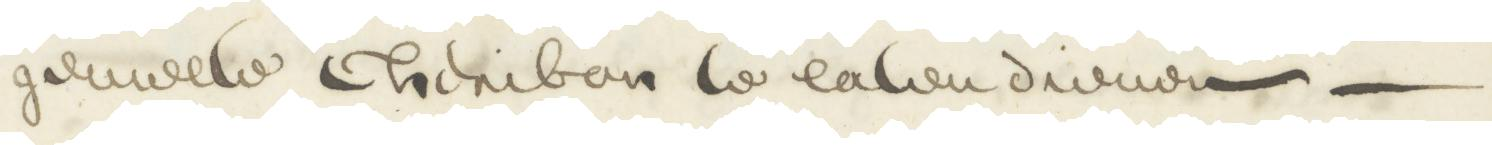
gemelte Cheribon te laten dienen —
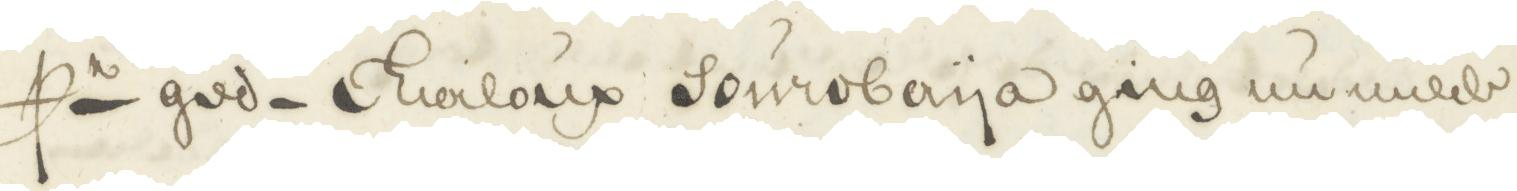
p=r ged=e Chialoup sourobaija ging nu mede
